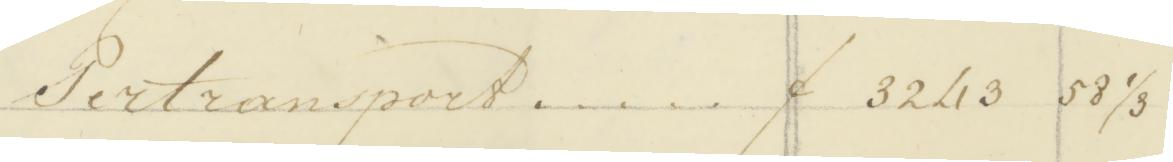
Pertransport . . . . . ƒ 3243 58 1/3
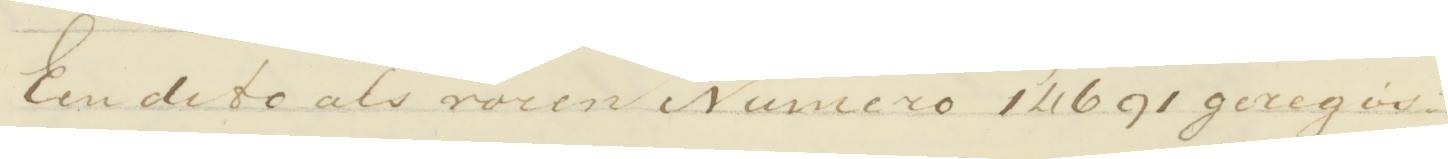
Een dito als voren Numero 14691 geregis„
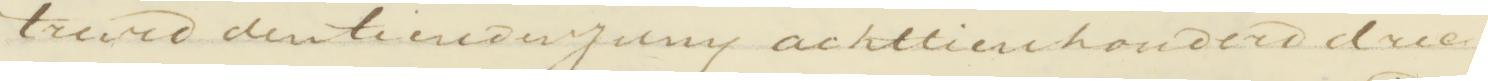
treerd den tienden Juny achttienhonderd drie
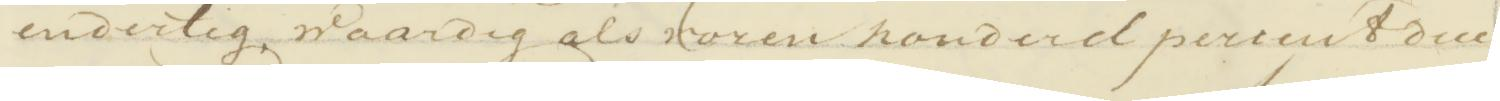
en dertig waardig als voren honderd percent dui
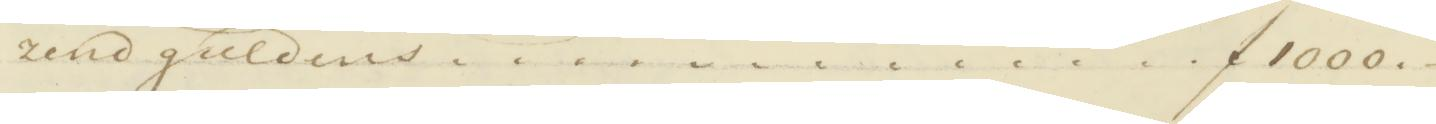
zend guldens . . . . . . . . . . . . . ƒ 1000.
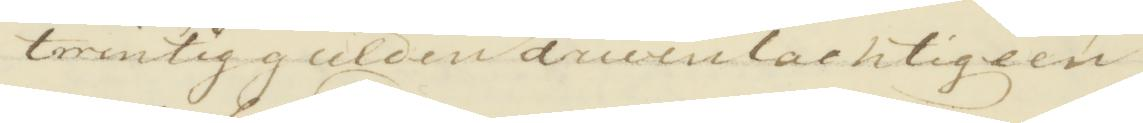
twintig gulden drieentachtig een
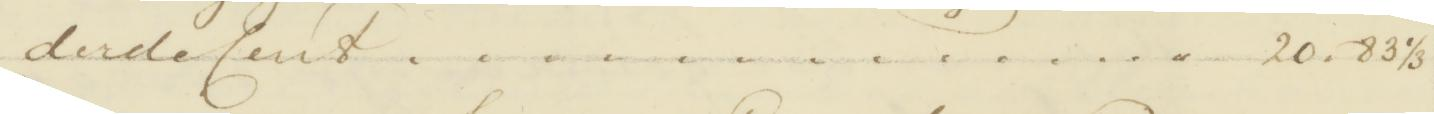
derde Cent . . . . . . . . . . . . . „ 20. 83 1/3
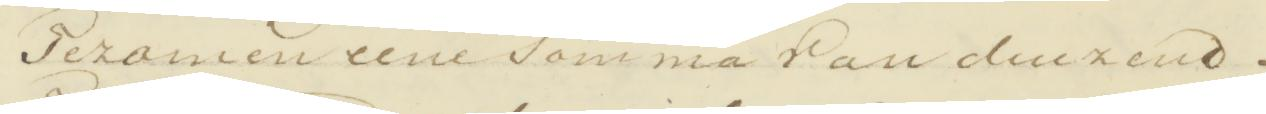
Tezamen eene somma Van duizend
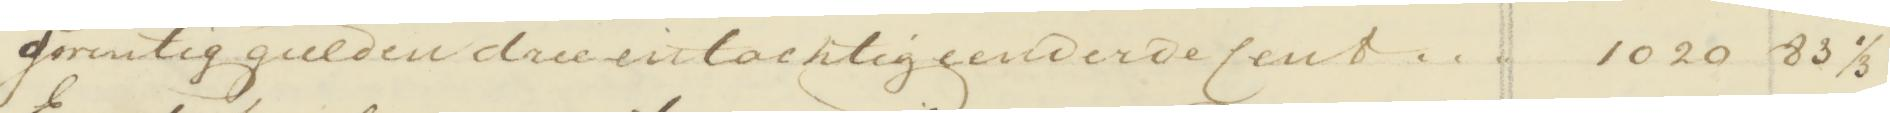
Twintig gulden drie en tachtig een derde Cent . . „ 1020 83 1/3
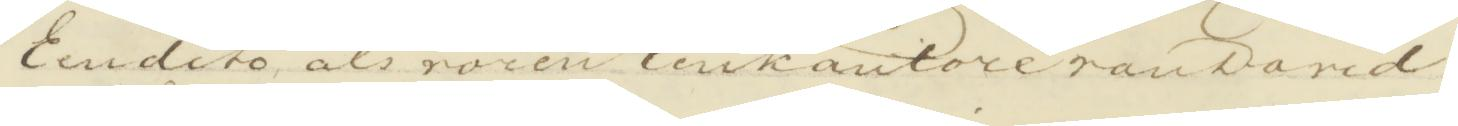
Een dito, als voren ten kantore van David
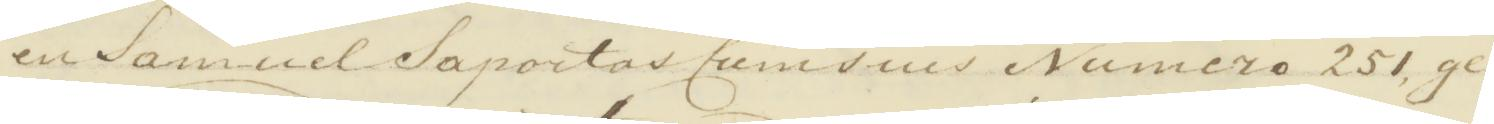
en Samuel Saportas Cum suis Numero 251, ge
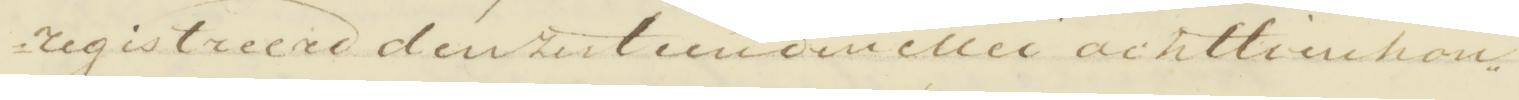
„registreerd den zestienden Mei achttienhon„
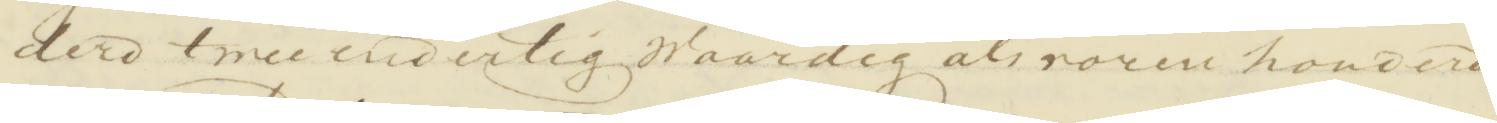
derd twee en dertig Waardig als voren honderd
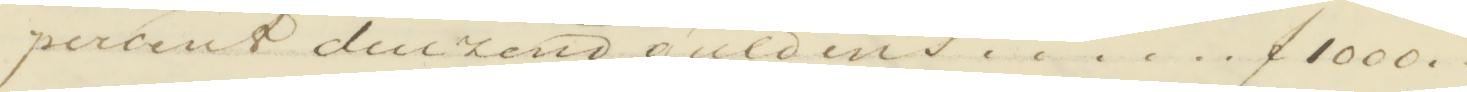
percent duizend guldens . . . . . . ƒ 1000.
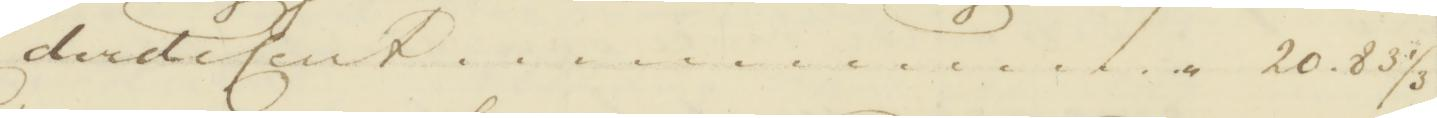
derde Cent . . . . . . . . . . . . . . . „ 20. 83 1/3
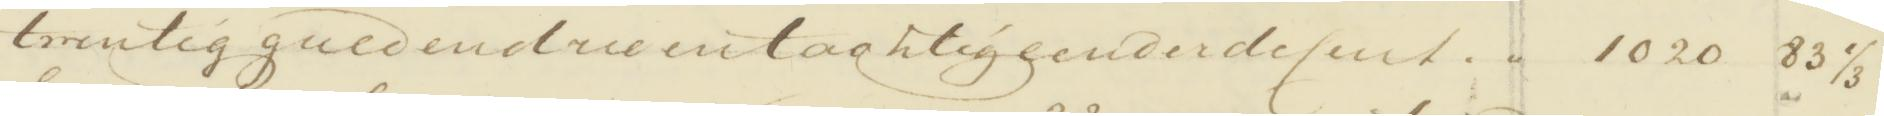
twintig gulden drie en tachtig een derde Cent . „ 1020 83 1/3
